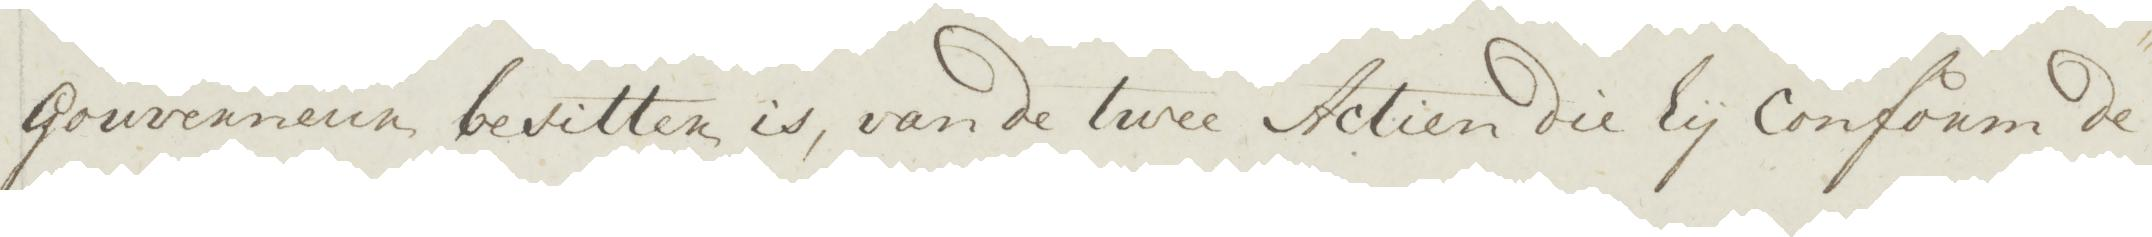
gouverneur besitter is, van de twee Actien die hij conform de
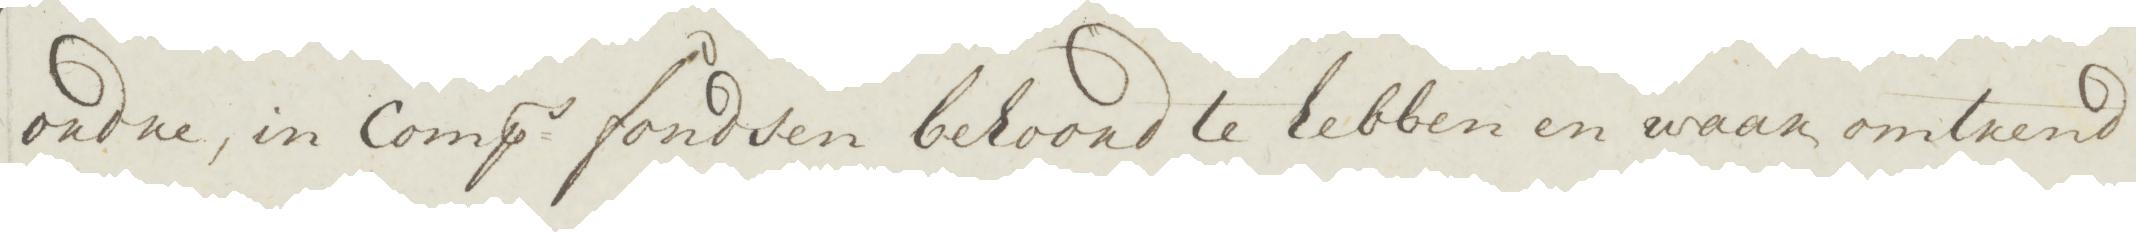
ordre, in Comp=s fondsen behoord te hebben en waar omtrend
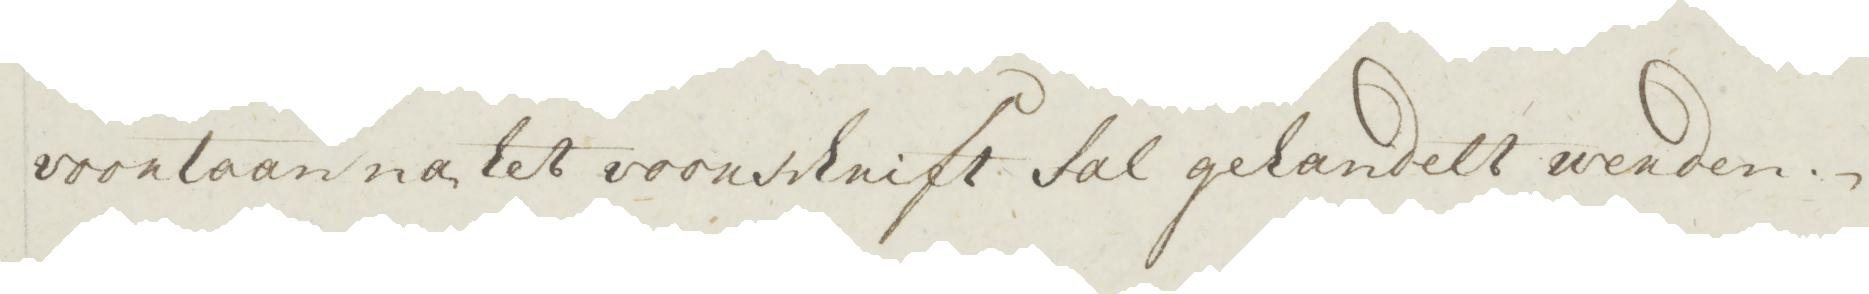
voortaan na het voorschrift sal gehandelt werden. —
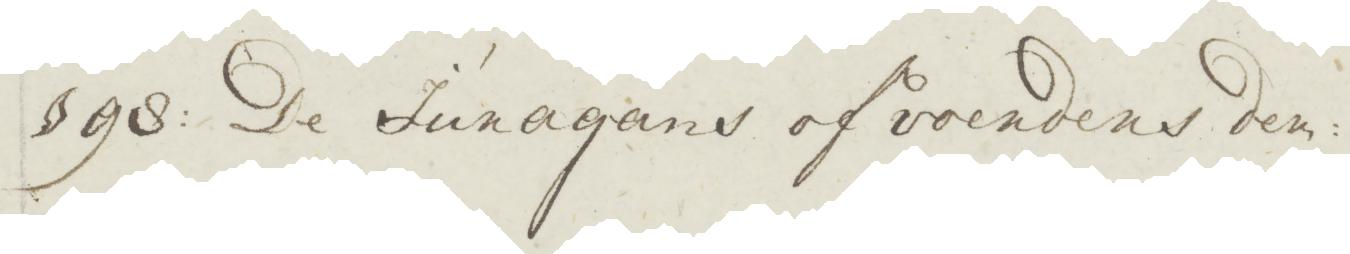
§ 98: De Iuragans of voerders den:
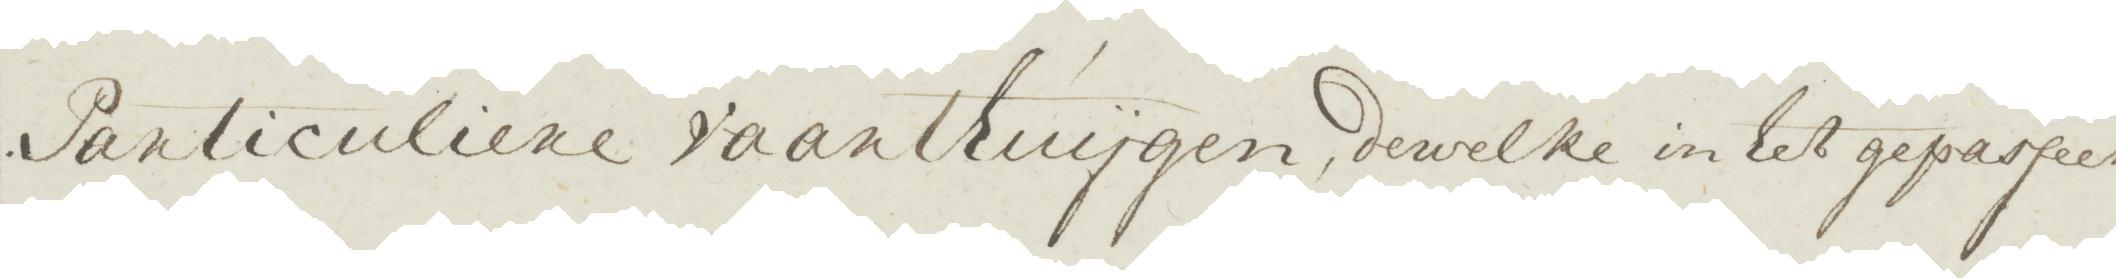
Particuliere vaarthuijgen, dewelke in het gepasseer
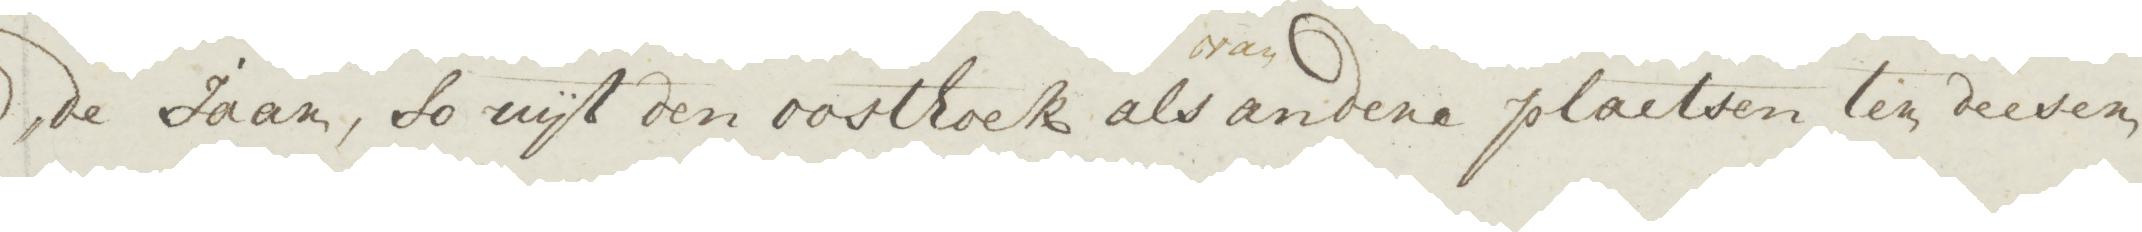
de Iaar, so uijt den oosthoek als van andere plaetsen ten deesen
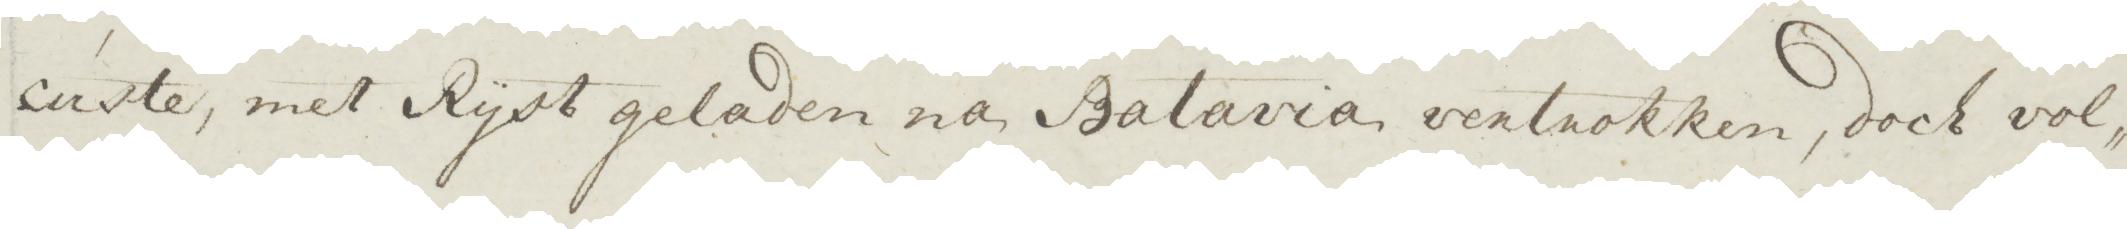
custe, met Rijst geladen na Batavia vertrokken, doch vol„
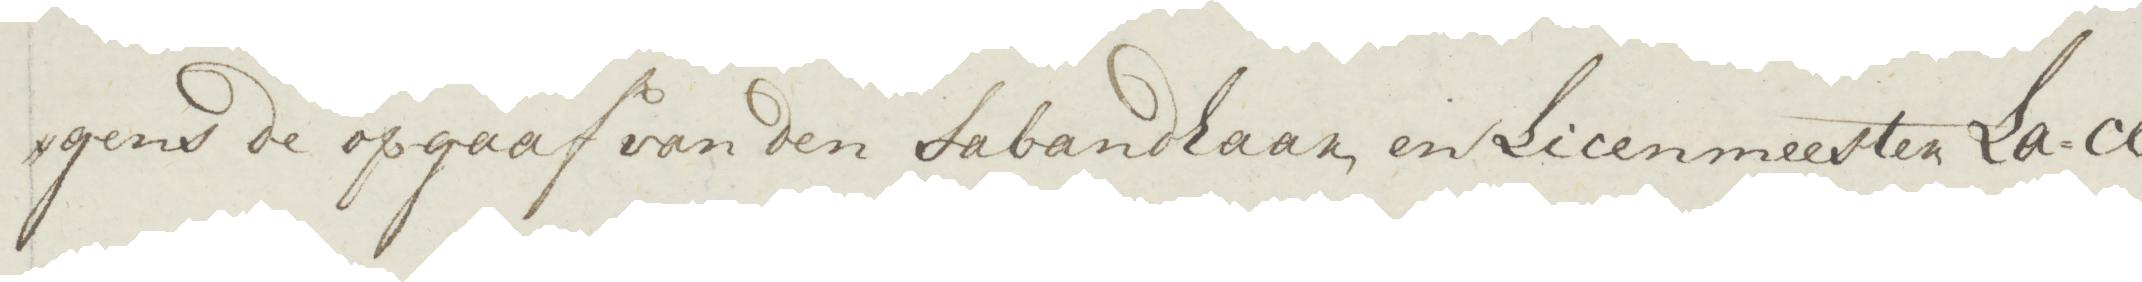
„gens de opgaaf van den sabandhaar en Licenmeester La=cl
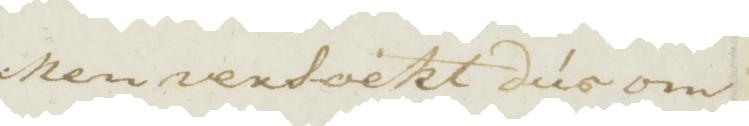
Men versoekt dus om
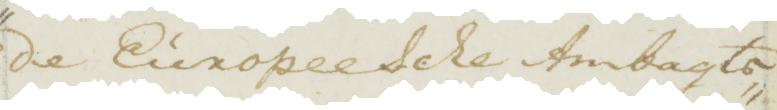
de Europeesche Ambagts„
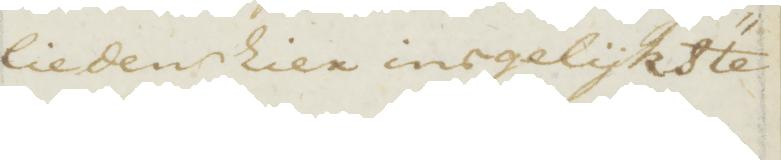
lieden hier insgelijkste
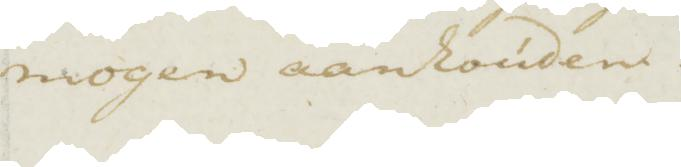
mogen aanhouden.
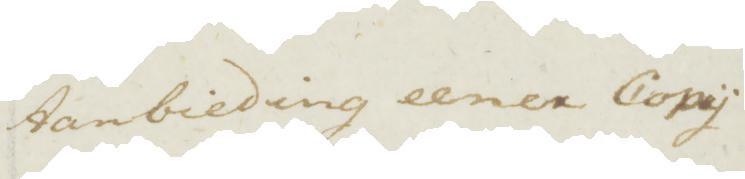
Aanbieding eener Copij
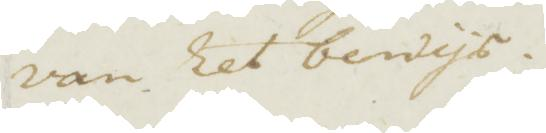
van het bewijs.
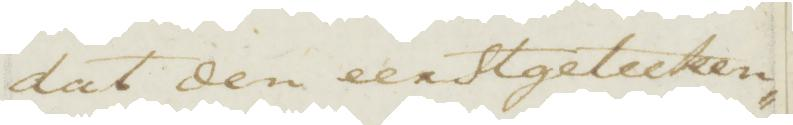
dat den eerstgeteeken„
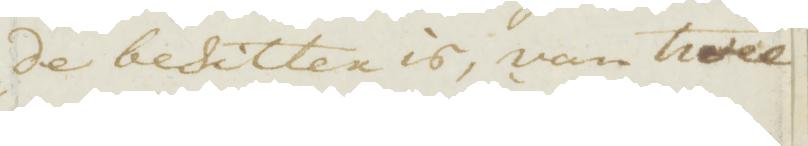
de besitter is, van twee
